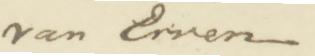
van Erven
